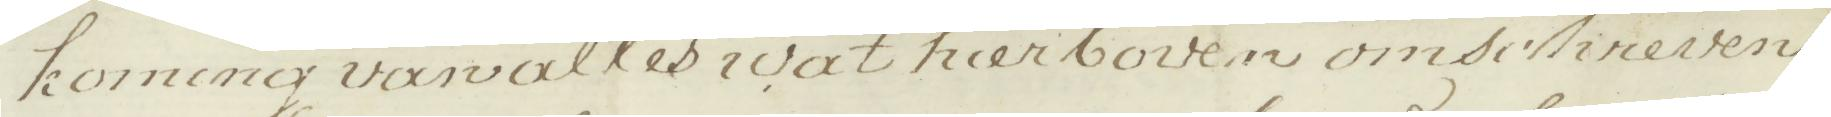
koming van alles wat hier boven omschreven
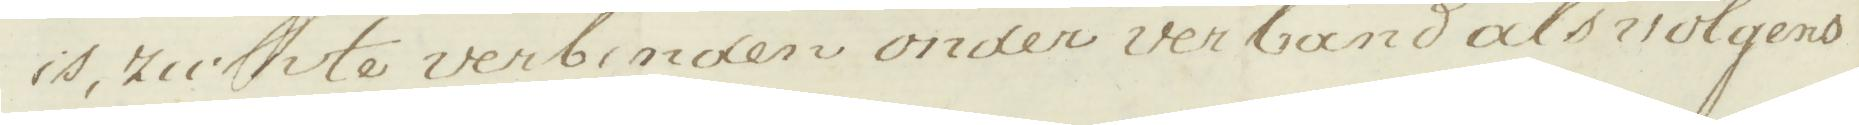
is, zich te verbinden onder verband als volgens
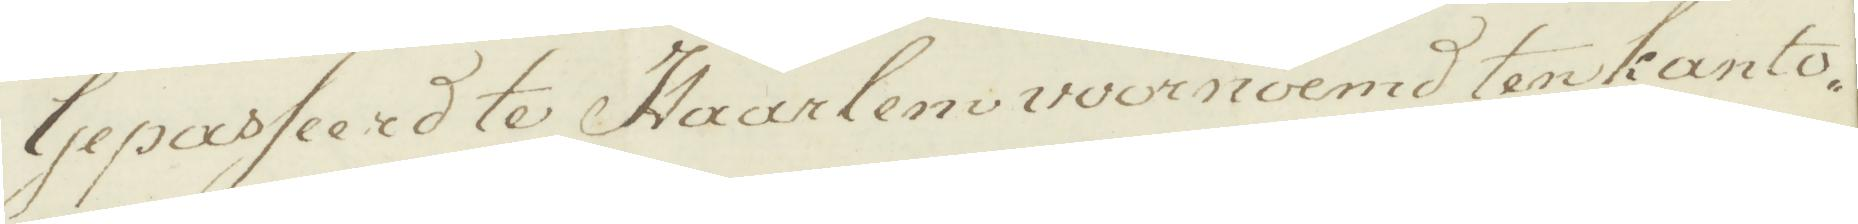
Gepasseerd te Haarlem voornoemd ten kanto„
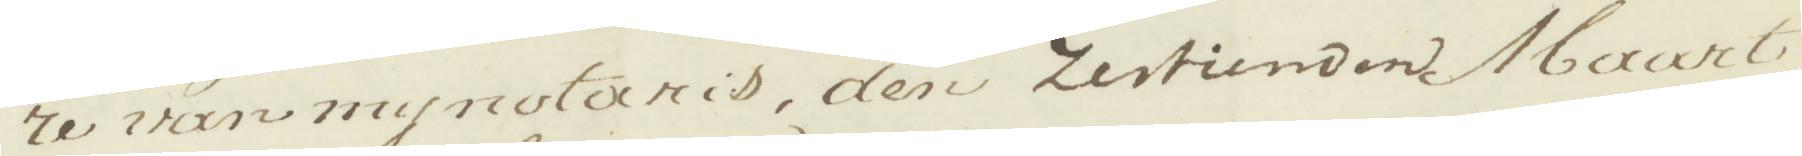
re van my notaris, den Zestienden Maart
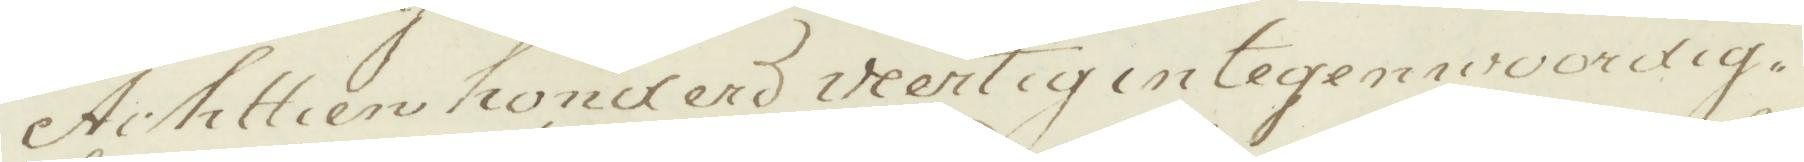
Achttien honderd veertig in tegenwoordig„
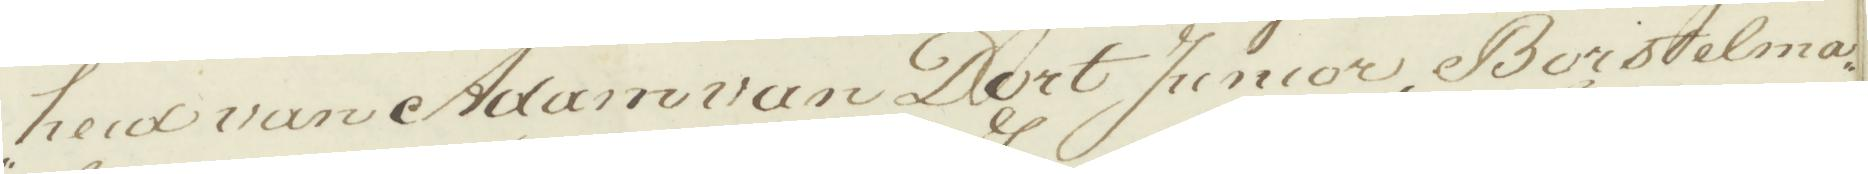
heid van Adam van Dort Junior, Borstelma„
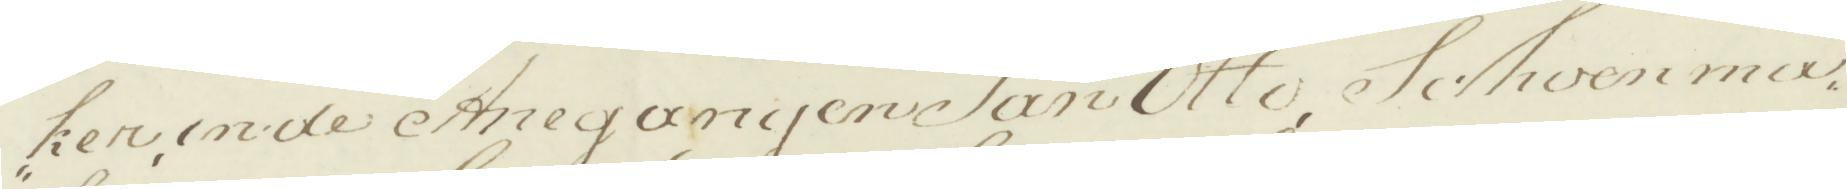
ker, in de Anegang en Ian Otto Schoenma„
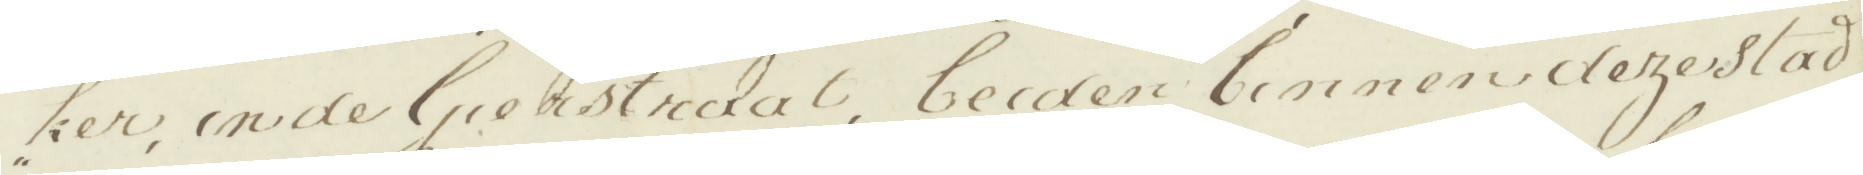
„ker, in de Gierstraat, beiden binnen deze stad
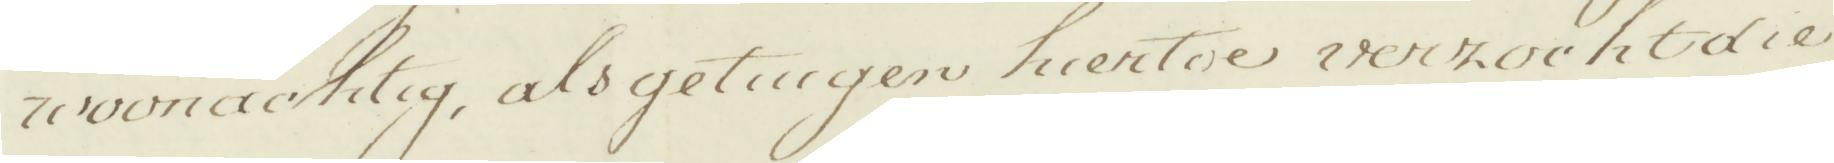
woonachtig, als getuigen hiertoe verzocht die
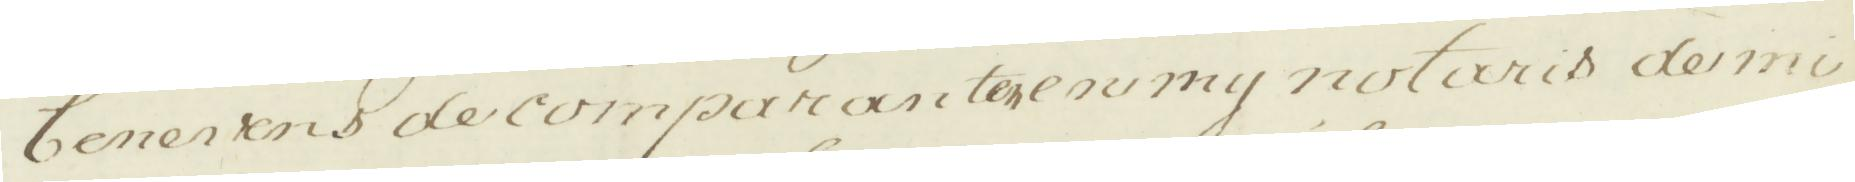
benevens de comparante en my notaris de mi
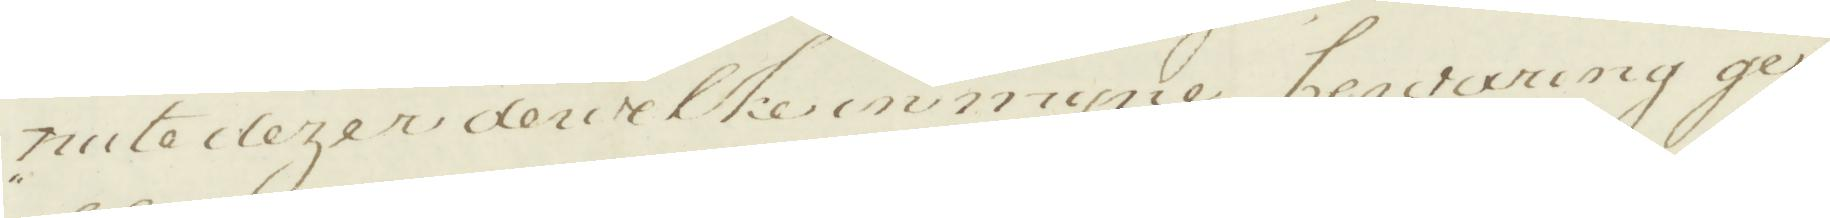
nute dezer dewelke in myne bewaring ge
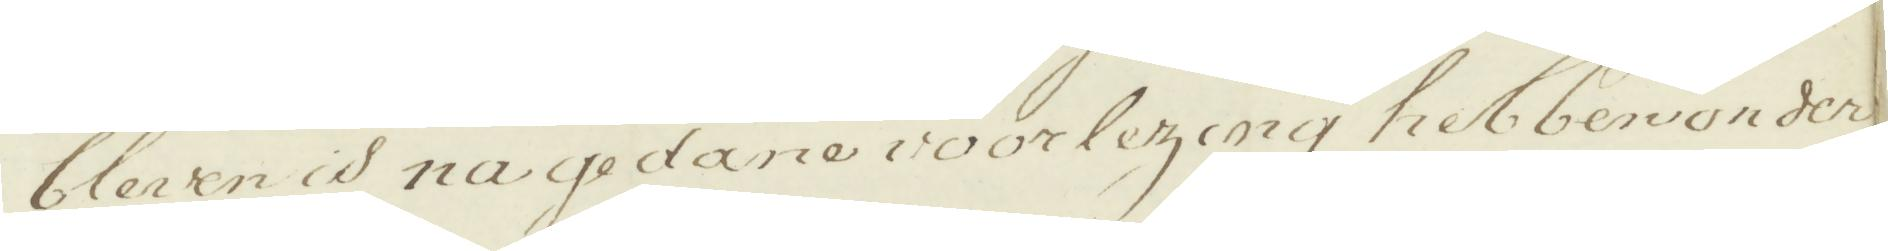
bleven is na gedane voorlezing hebben onder
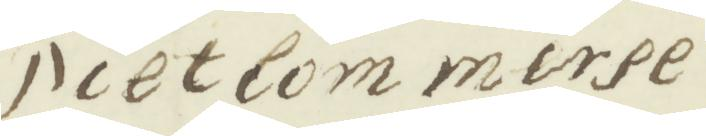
Piet Commerse
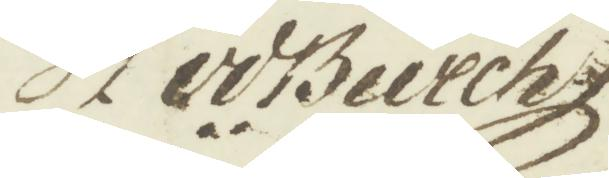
H vdBurch
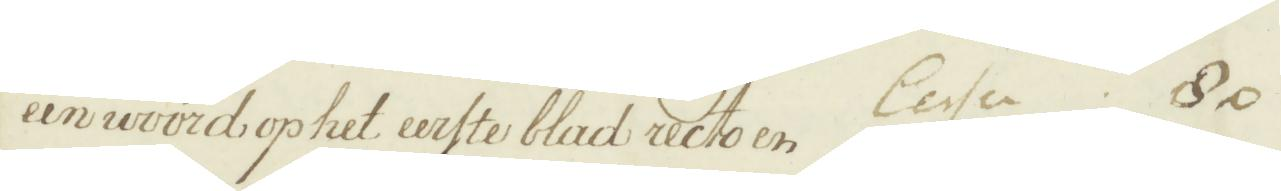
een woord op het eerste blad recto en Cyfer
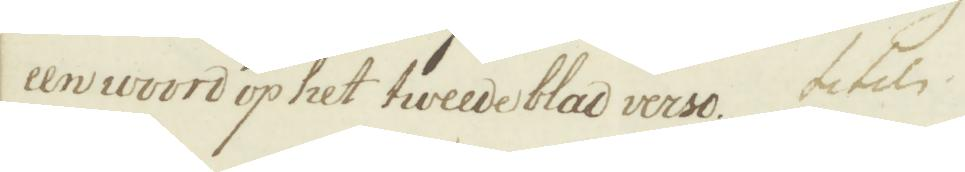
een woord op het tweede blad verso. titels
